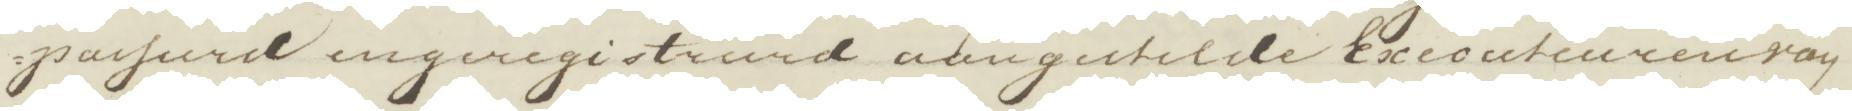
„passeerd en geregistreerd aangestelde Executeuren van
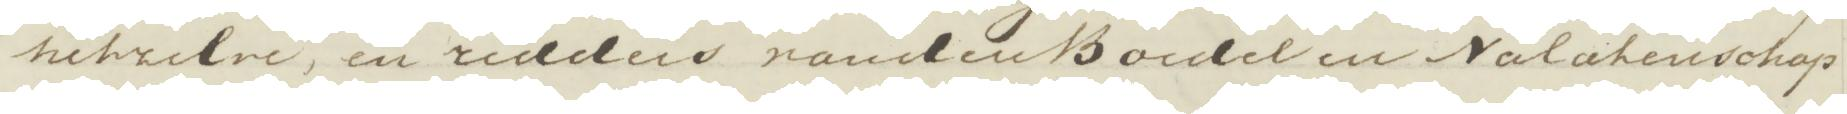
hetzelve, en redders van den Boedel en Nalatenschap
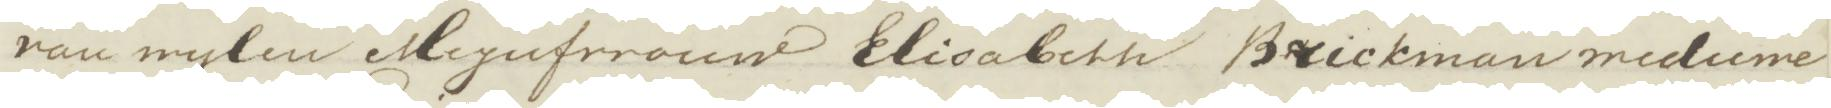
van wylen Mejufvrouw Elisabeth Brickman weduwe
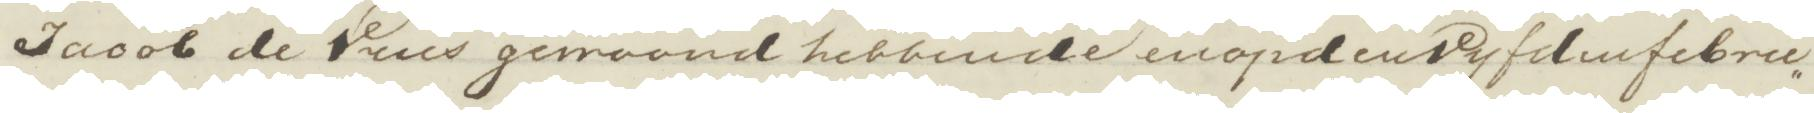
Iacob de Vries gewoond hebbende en op den Vyfden febru„
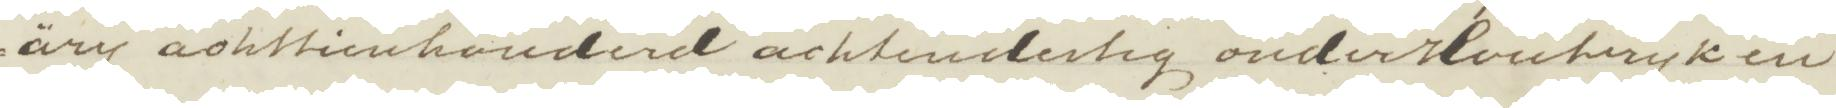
ary achttienhonderd achtendertig onder Houtrijk en
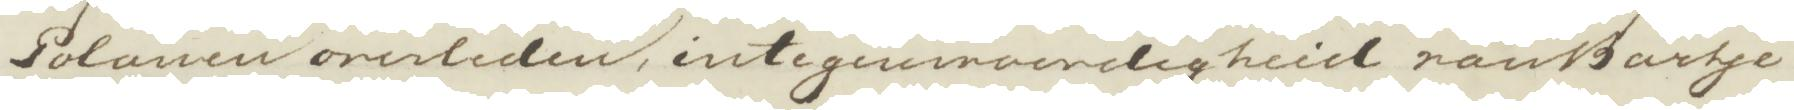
Polanen overleden, in tegenwoordigheid van Bartje
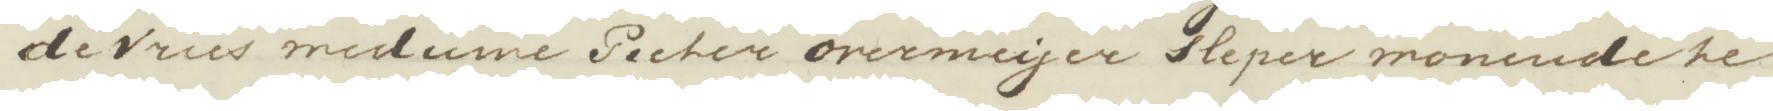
de Vries weduwe Pieter overmeijer sleper wonende te
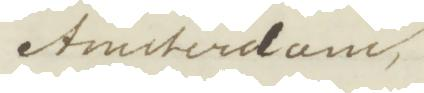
Amsterdam,
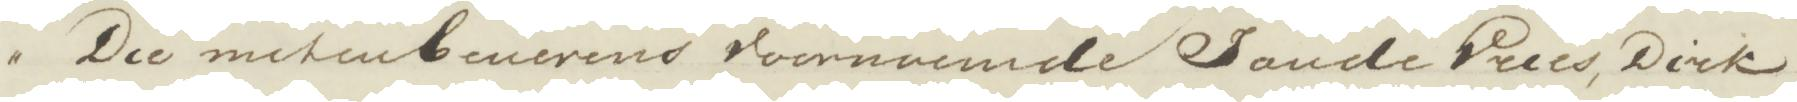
„ Die met en benevens voornoemde Ian de Vries, Dirk
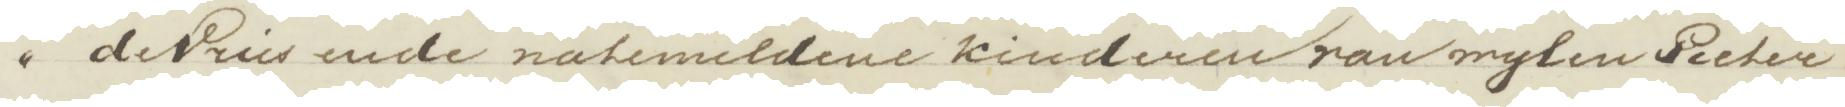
„de Vries ende natemeldene kinderen van wylen Pieter
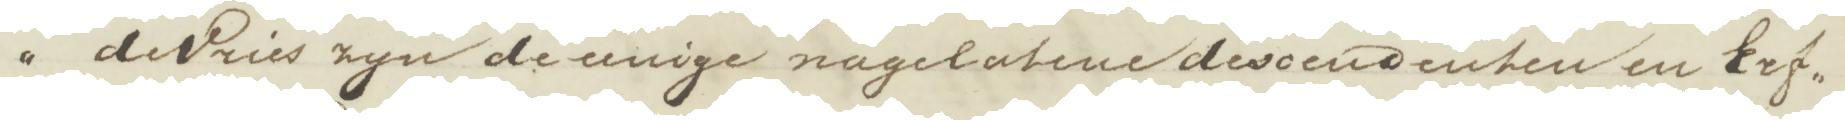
„de Vries zyn de eenige nagelatene descendenten en Erf„
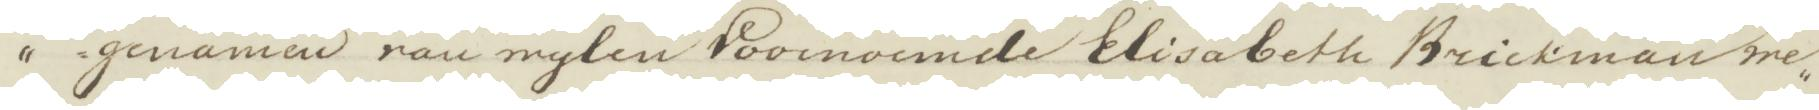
„ genamen van wylen Voornoemde Elisabeth Brickman we„
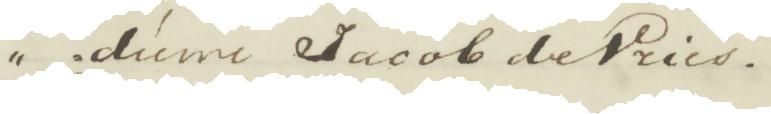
„ duwe Iacob de Vries.
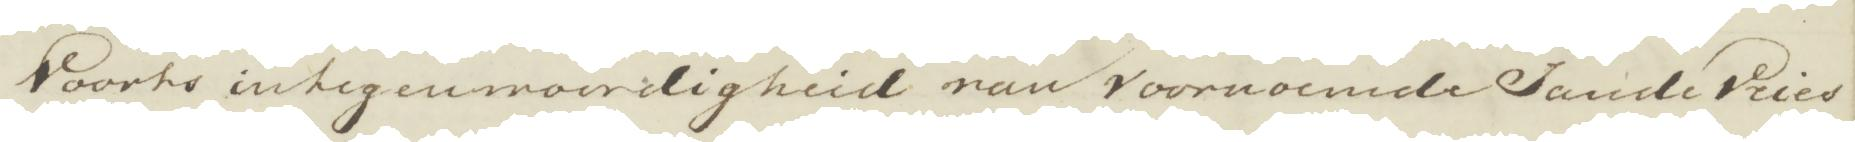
Voorts in tegenwoordigheid van voornoemde Ian de Vries
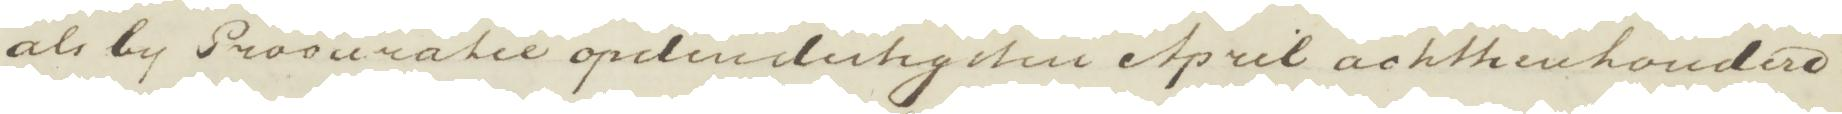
als by Procuratie opden dertigsten April achttienhonderd
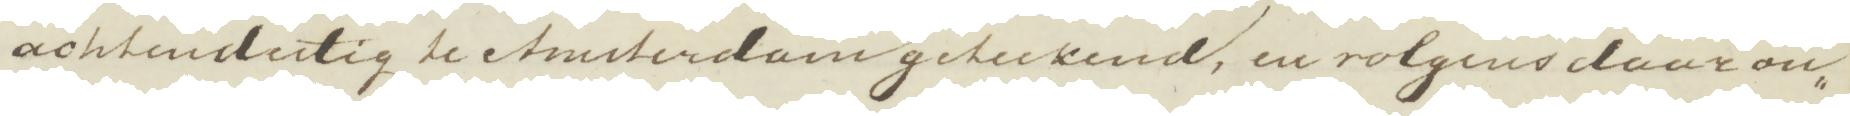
achtendertig te Amsterdam geteekend, en volgens daar on„
